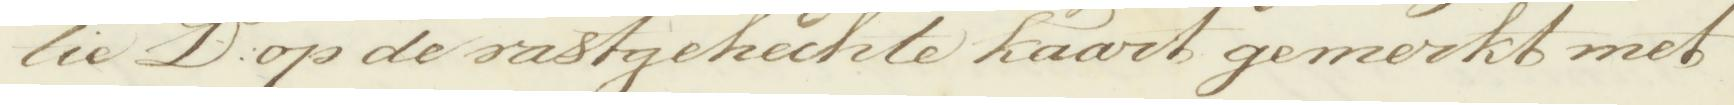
tie D: op de vastgehechte kaart gemerkt met
